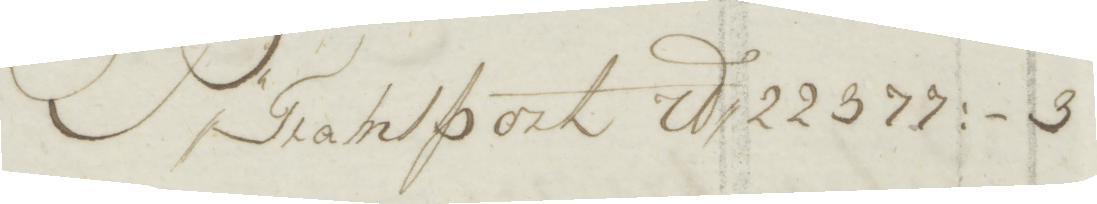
P„r Transport rd„s 22377: - 3
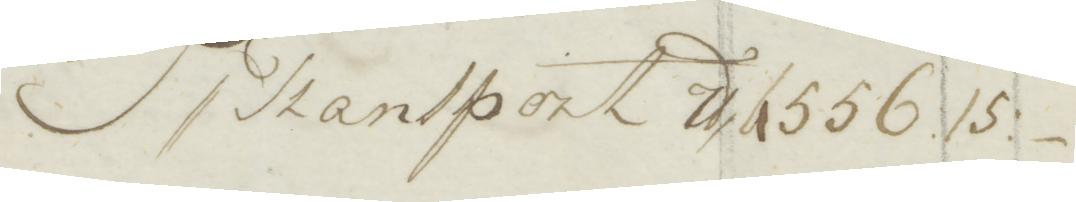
P„r Transport rd„s 4556: 15:—
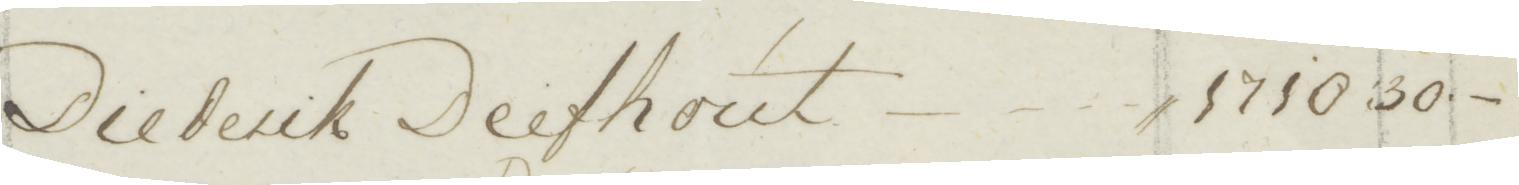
Diederik Deefhout — – - - „1710:30. —
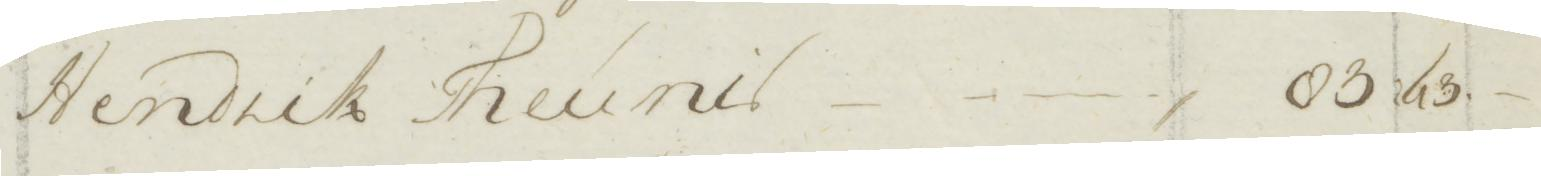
Hendrik Theunis — – – – - „ 83:43. —
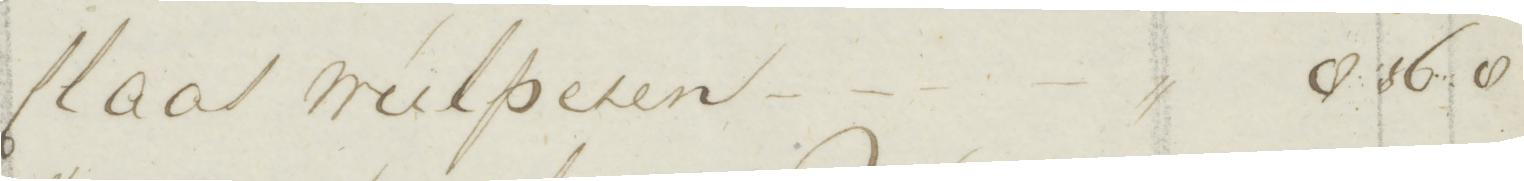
Claas wulperen – – – – „ 8:16: 8
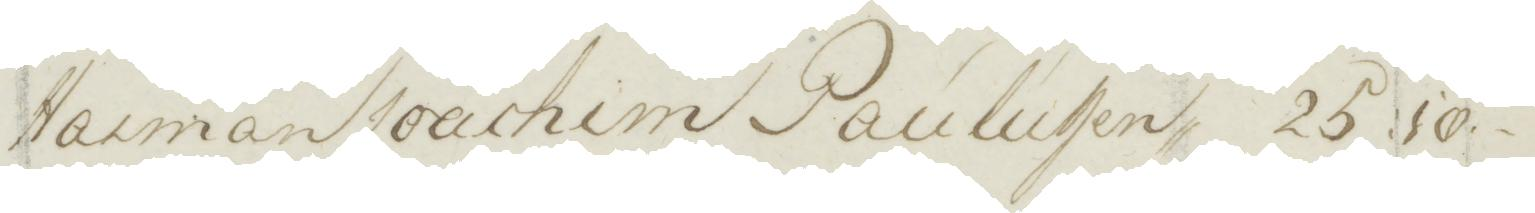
Harman joachim Paulussen „ 25:18. —
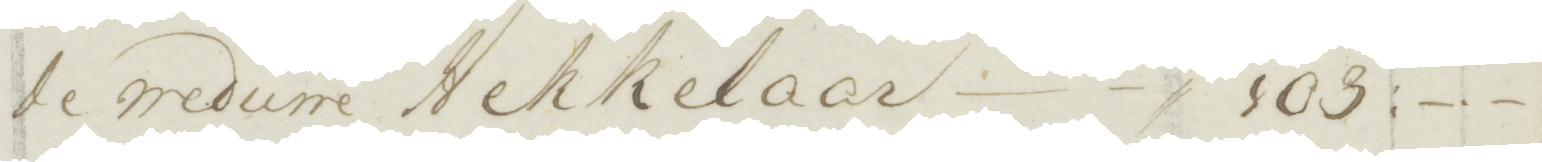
de weduwe Hekkelaar — – „ 103: — . —
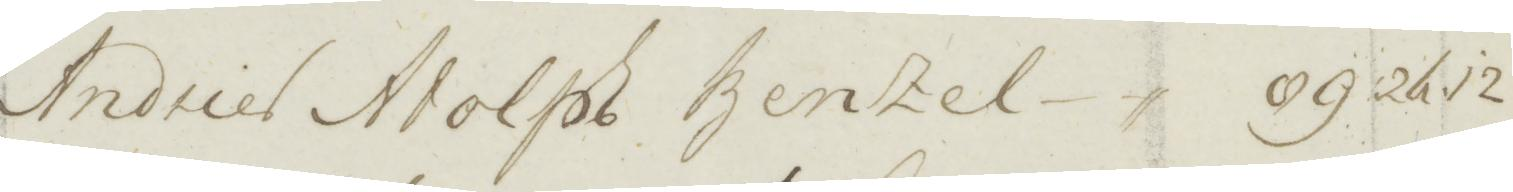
Andries Adolph Benzel — – „ 89:24.12
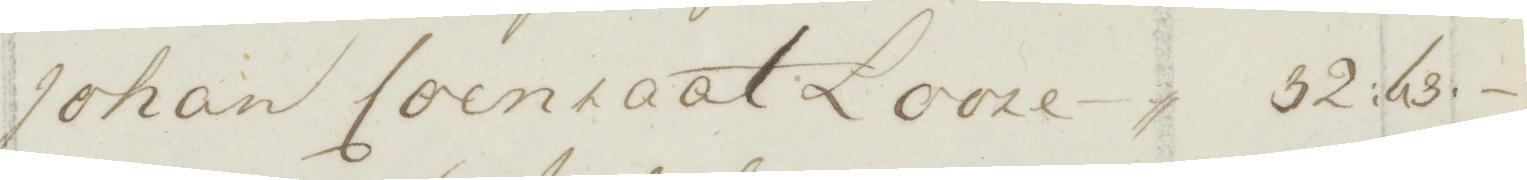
Johan Coenraat Loore — -„ 32:43: —
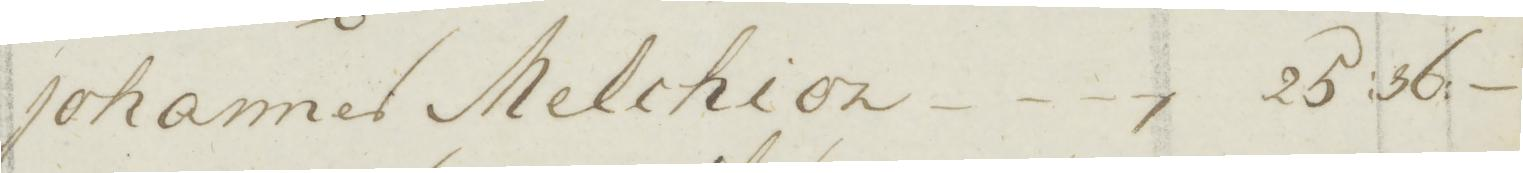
Johannes Melchior – – – –„ 25:36: —
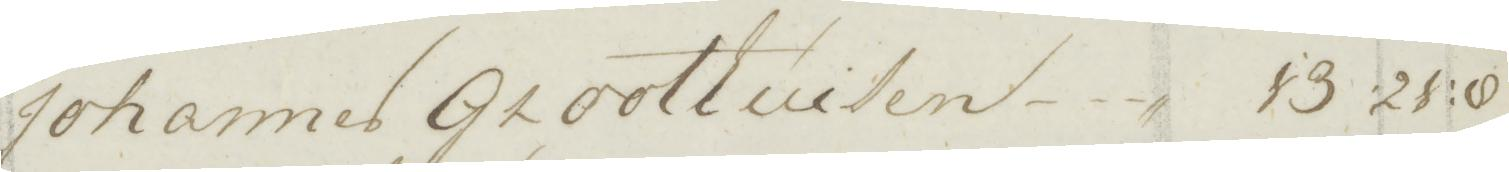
Johannes Groothuisen – – –„ 13:21:8
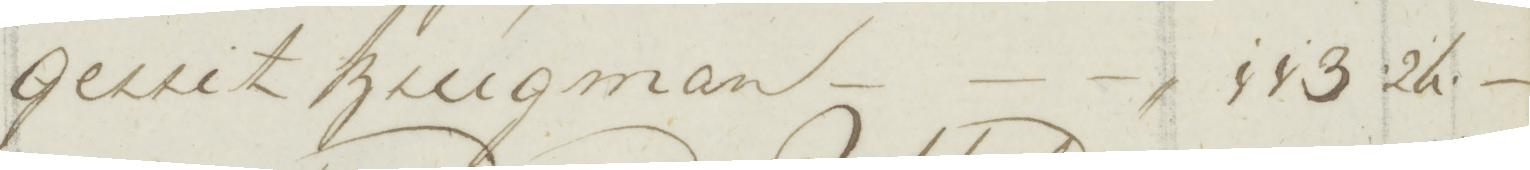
Gerrit Brugman — — — „ 113:24. —
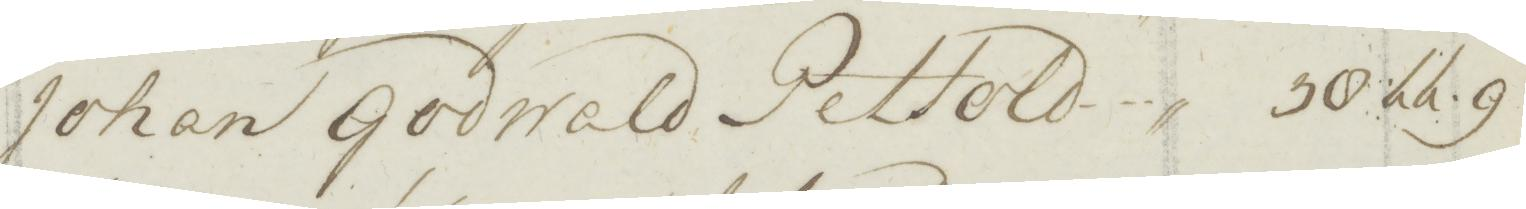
Johan Godwald Pettold – - - „ 38:44. 9
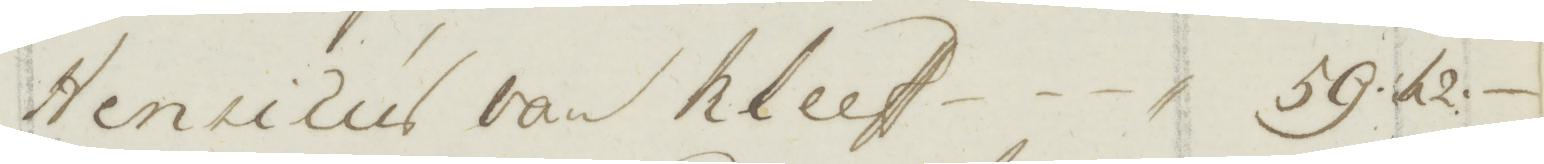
Henricus van kleeff – – – „ 59.:42: —
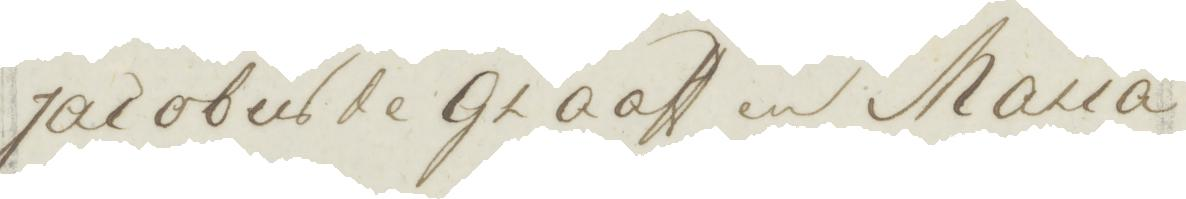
Jacobus de Graaff en Maria
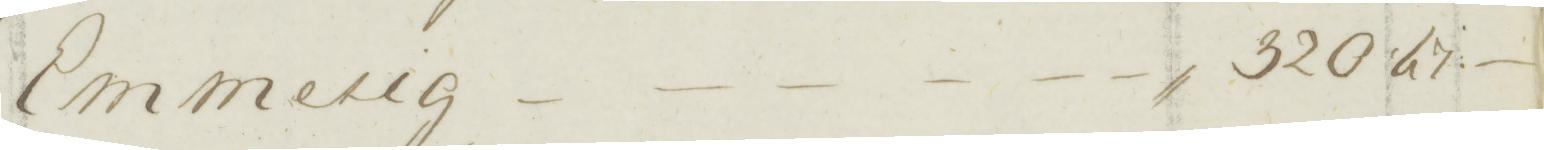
Emmerig — — — — — — „ 320:47: —
